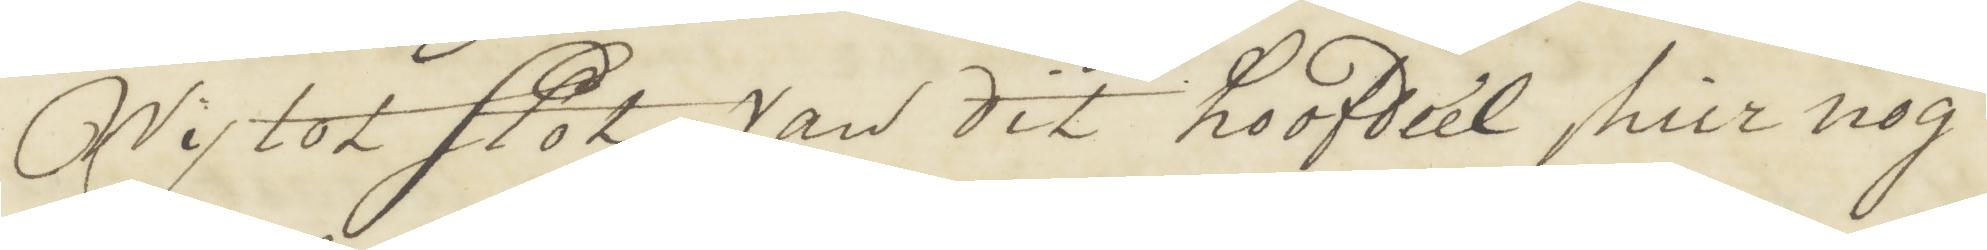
wij tot slot van dit hoofdeel, hier nog
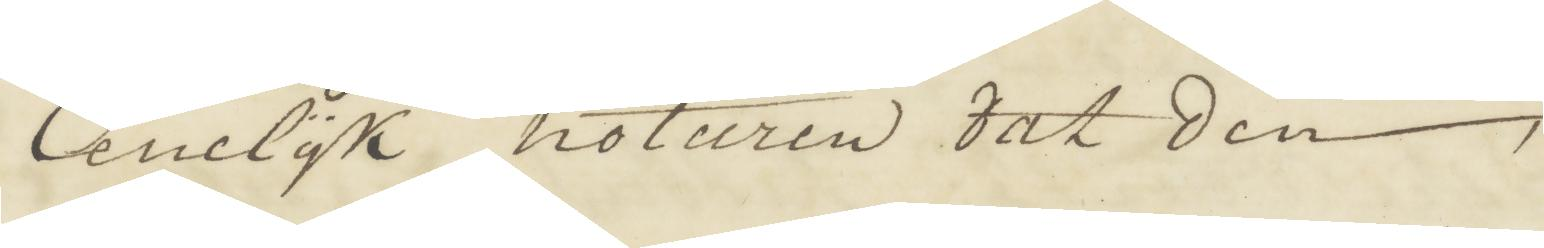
Eenelijk noteren dat den
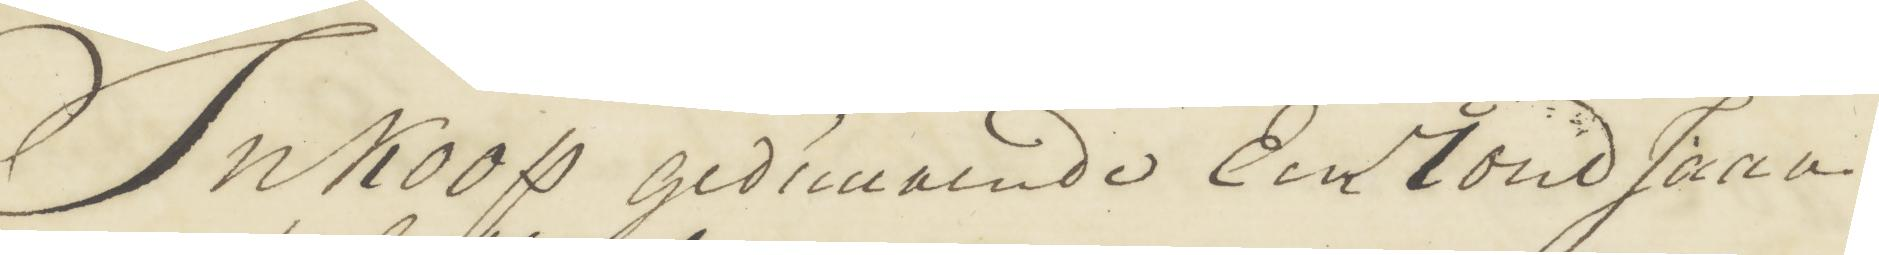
Inkoop geduurende Een rond Jaar
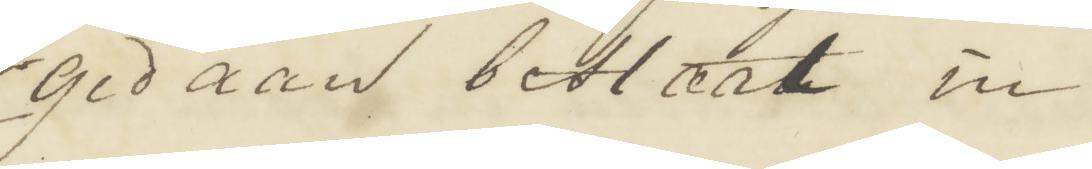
gedaan bestaat in
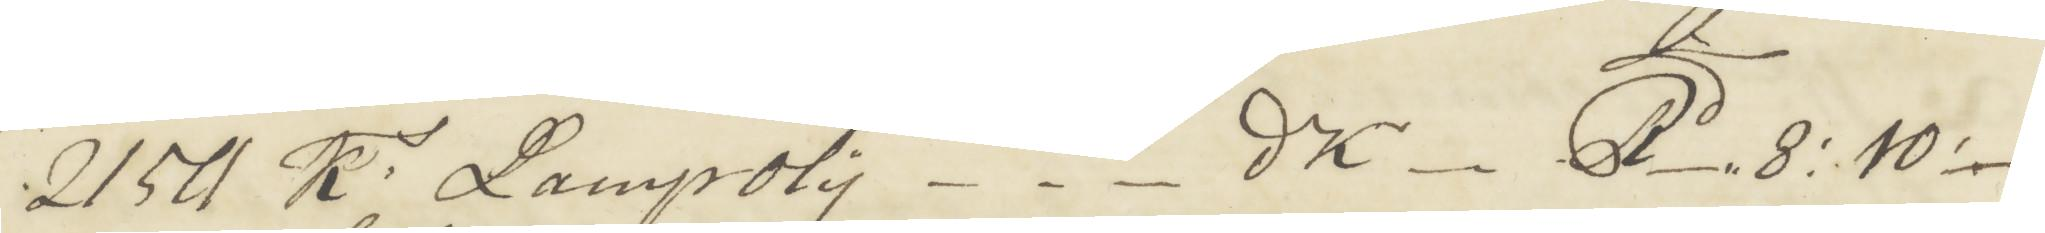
2154 k:s Lampolij - - - dk — R-d„ 8: 10:—
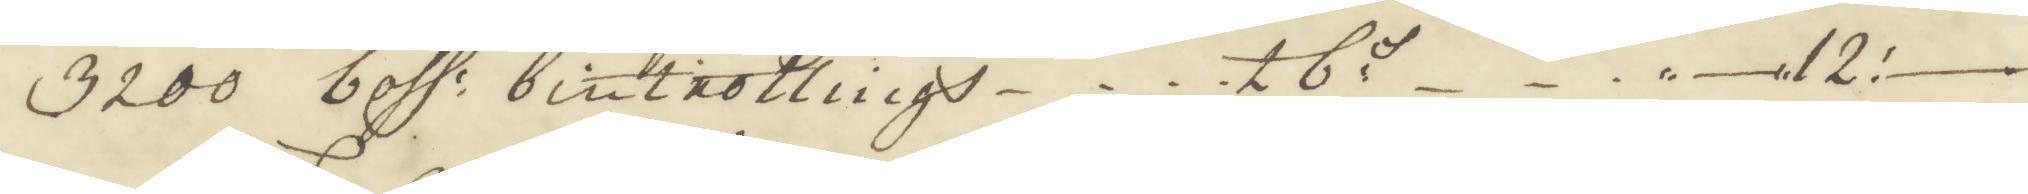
3200 boss: bintrottings - . . . tb:s - - .„ —„12:—
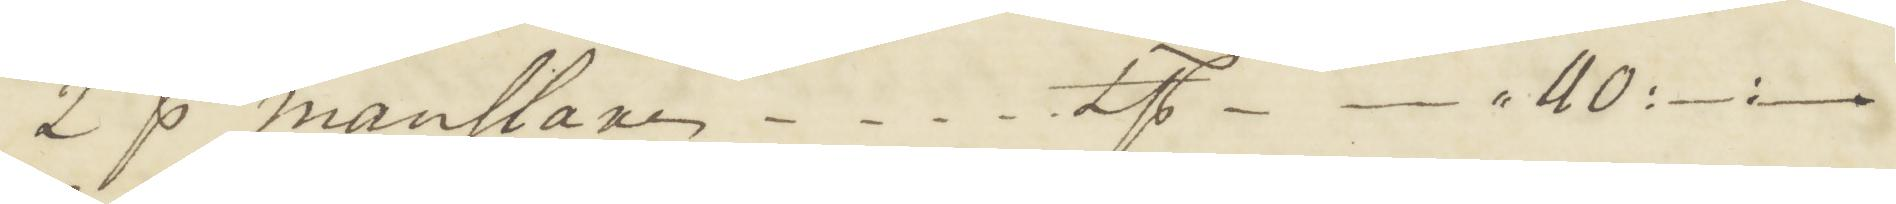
2 ps manslaren - - - - . tps — — „ 40: —:—
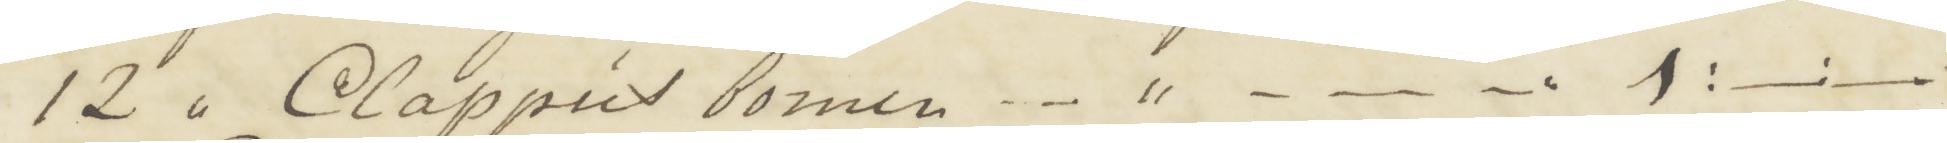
12 „ Clappus bomen - - „ — — —„ 1:—:—
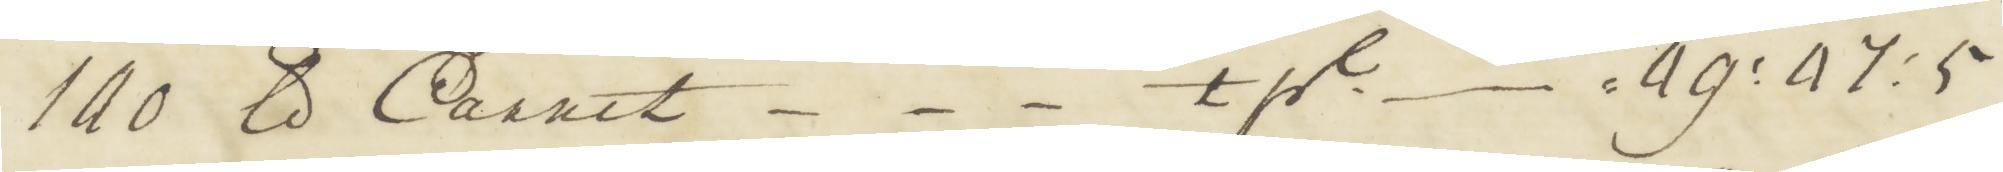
140 lb Carrit - - - tp.l —„ 49: 47: 5
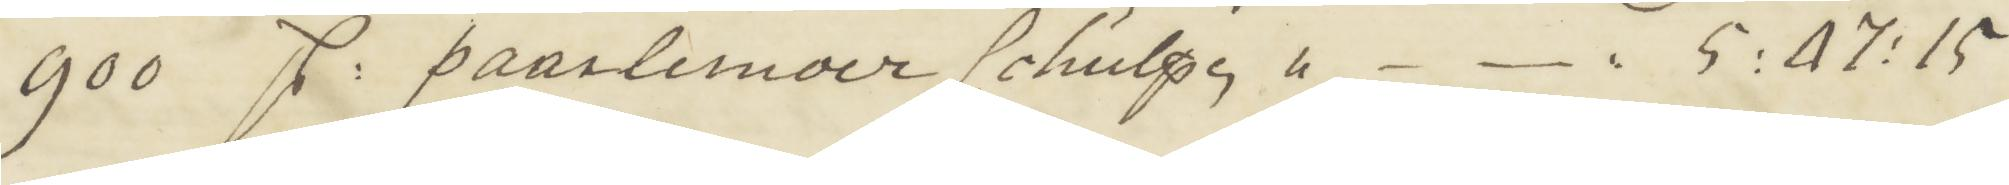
900 p:s paarlemoer schulpen „ — — : 5: 47: 15
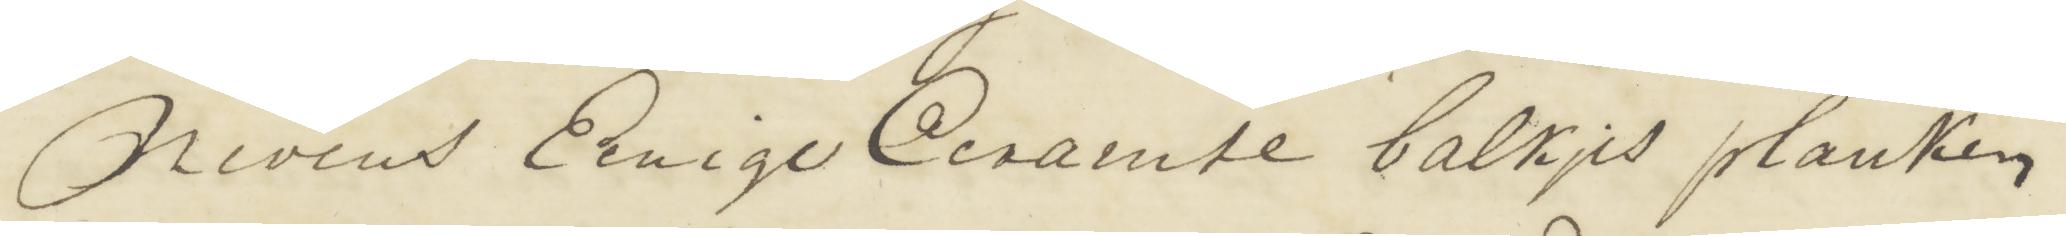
Nevens Eenige Ceramte balkjis planken
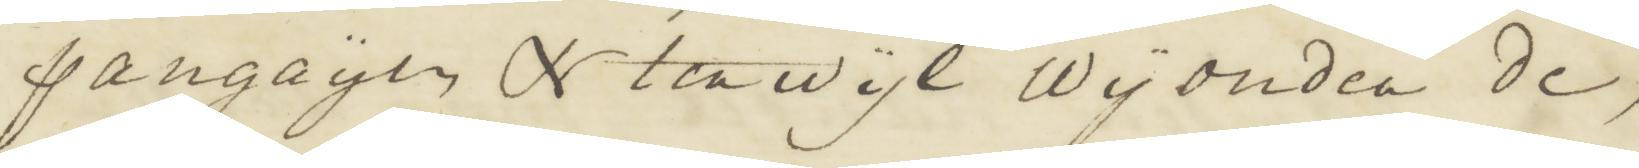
pangaijen & terwijl wij onder de
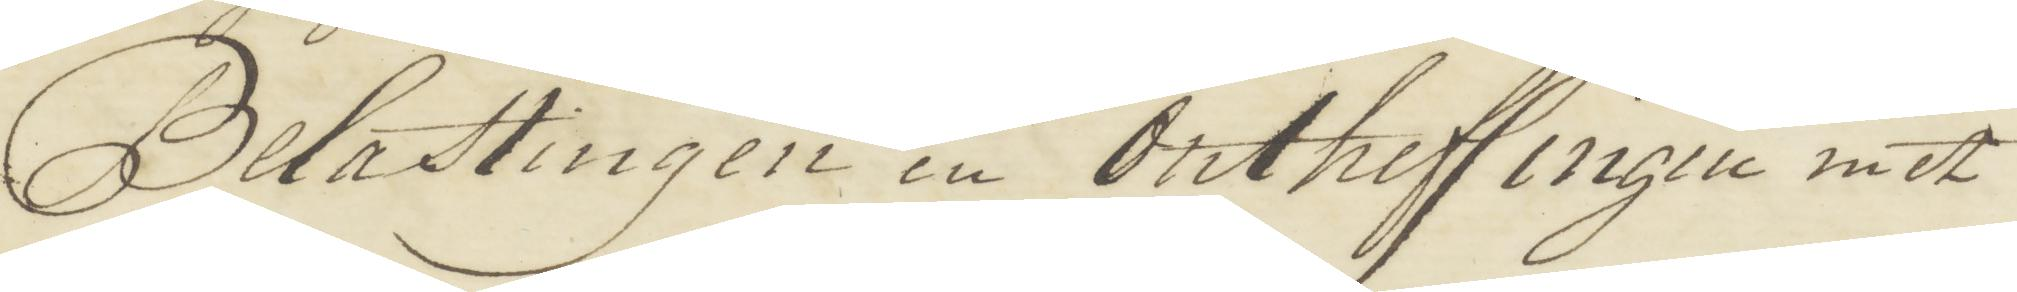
Belastingen en ontheffingen met
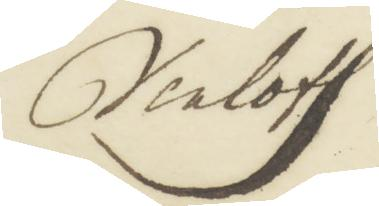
Verloff
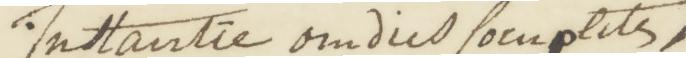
Jnstantie omdies complete
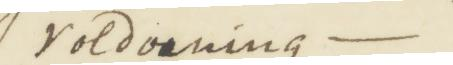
voldoening.
